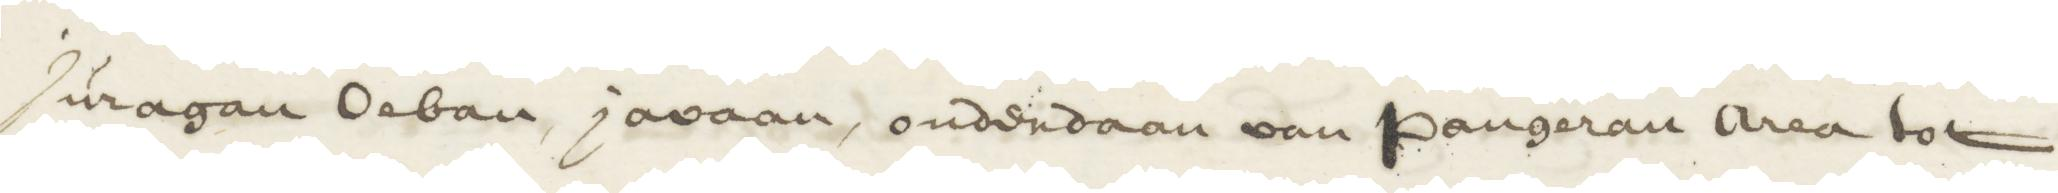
Juragan Oeban, javaan, onderdaan van Pangeran Area tot
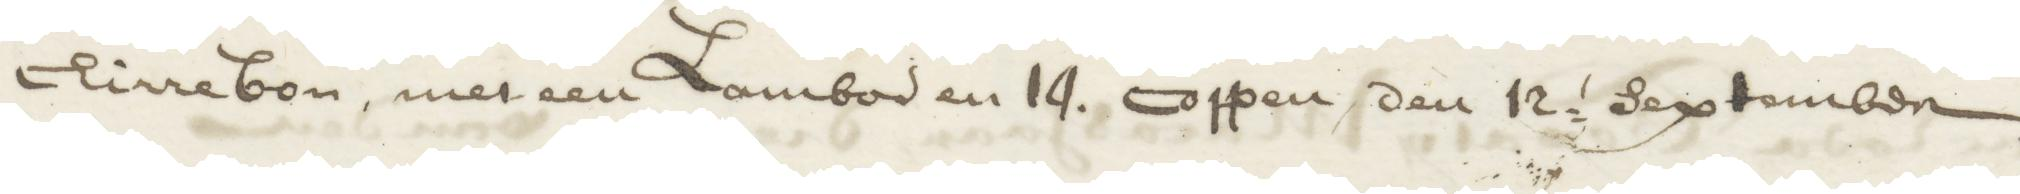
chirrebon, met een Lamboe en 14. coppen, den 12=' september
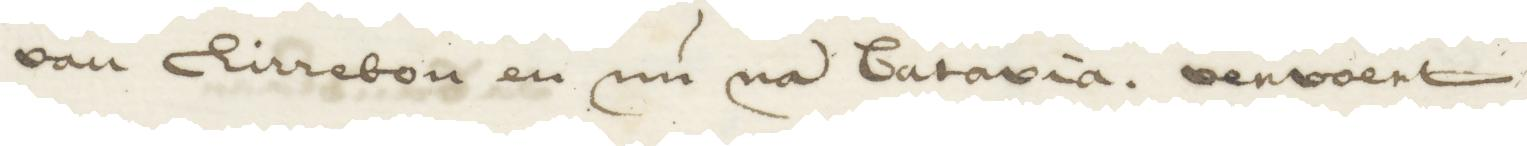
van chirrebon en nu na batavia. vervoert
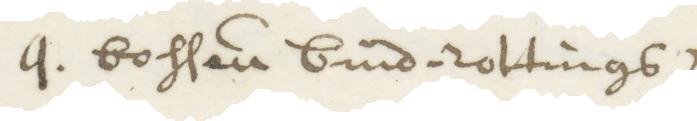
4. bossen bind-rottings
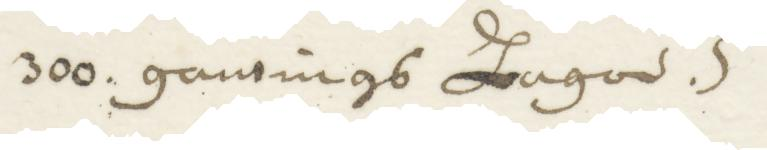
300. gantings Zagoe.
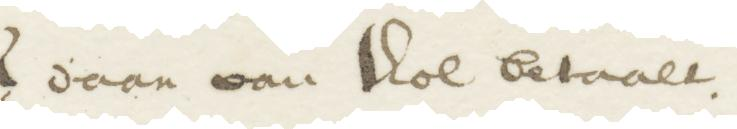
daar van thol betaalt.
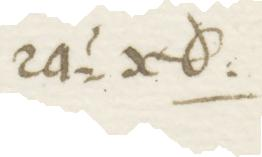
24=' xb:
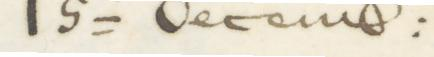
15=' decemb:
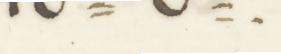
16=' d=o.
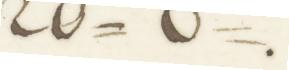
20=' d=o.
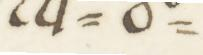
24=' d=o
